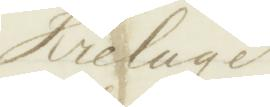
Krelage
